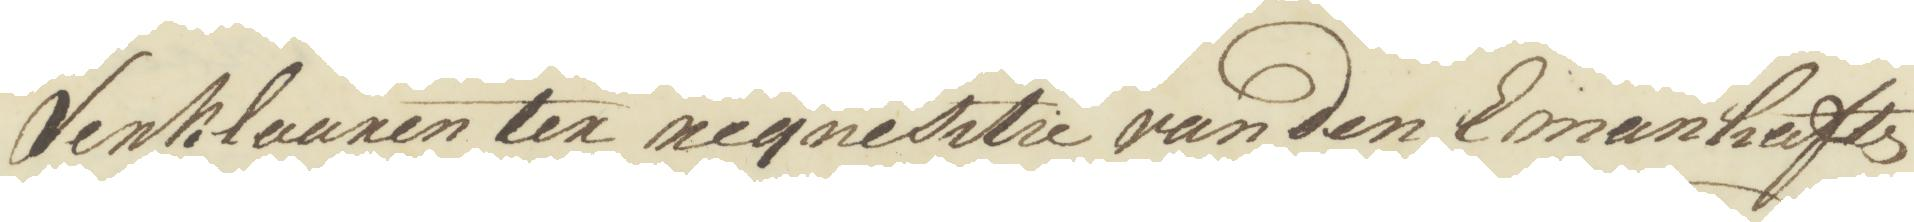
Verklaaren ter requesitie van den E manhaften
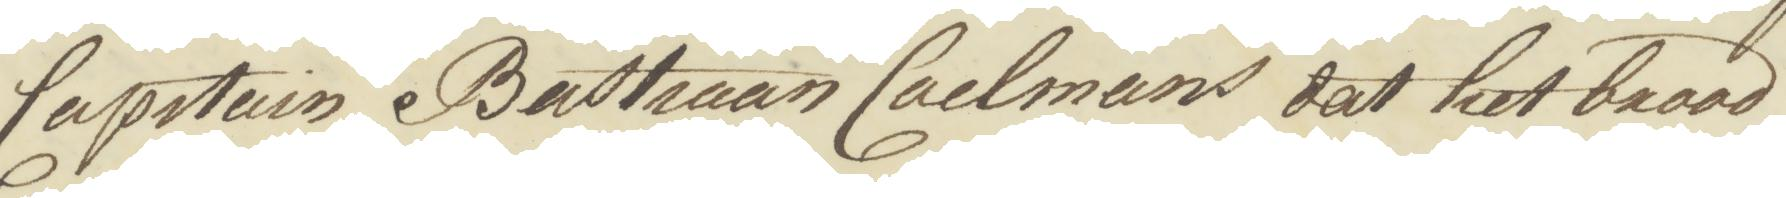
Capitain Bastiaan Coelmans dat het brood
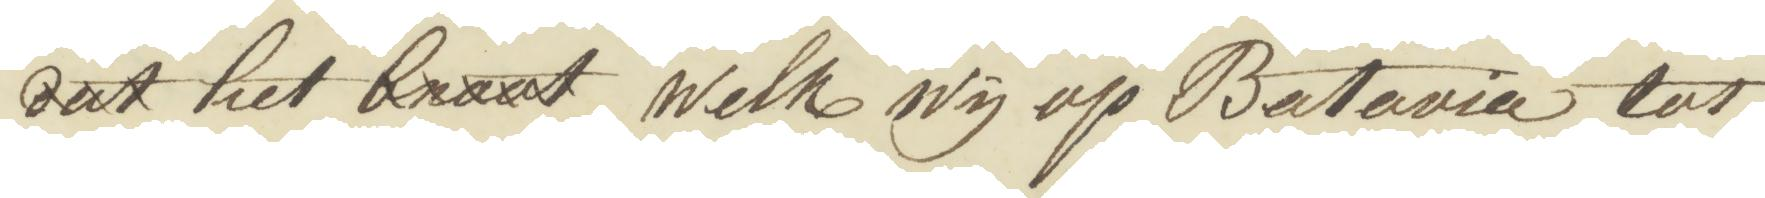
dat het broot welk wij op Batavia tot
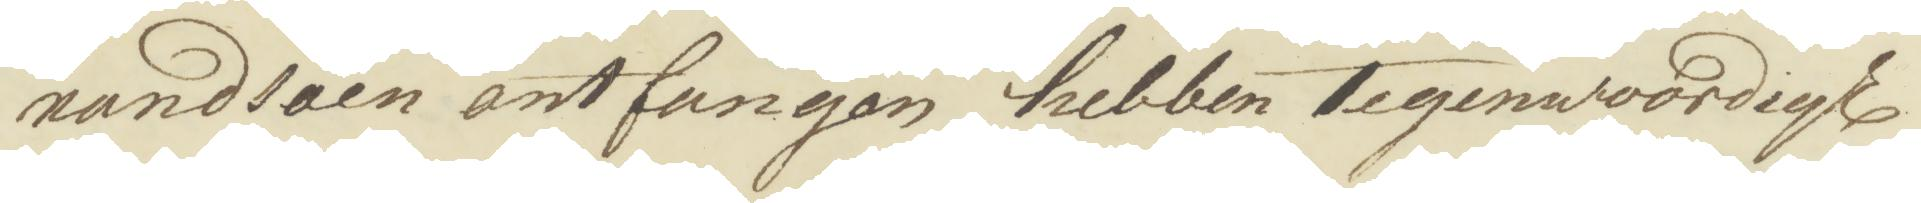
randsoen ontfangen hebben tegenwoordigh
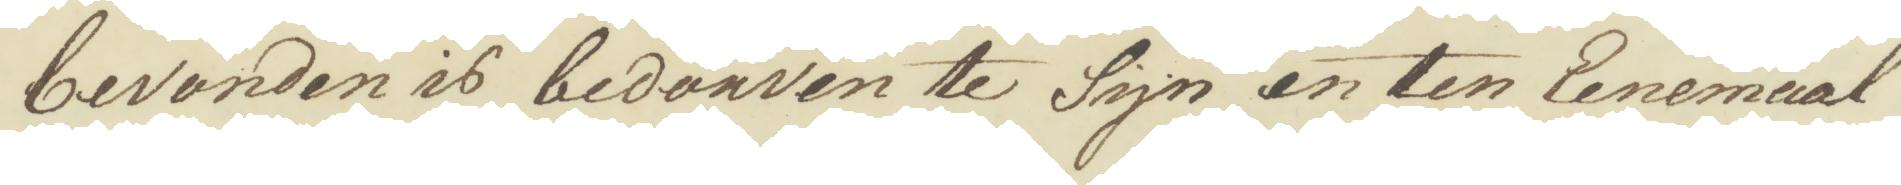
bevonden is bedorven te sijn en ten eenemaal
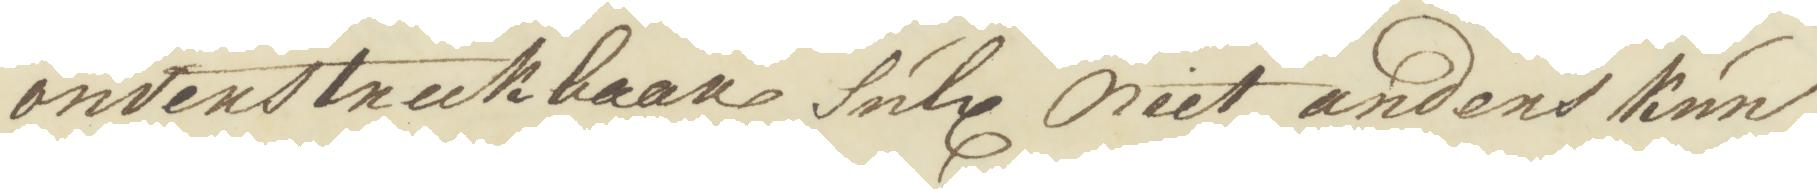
onverstreckbaar sulx niet anders kun
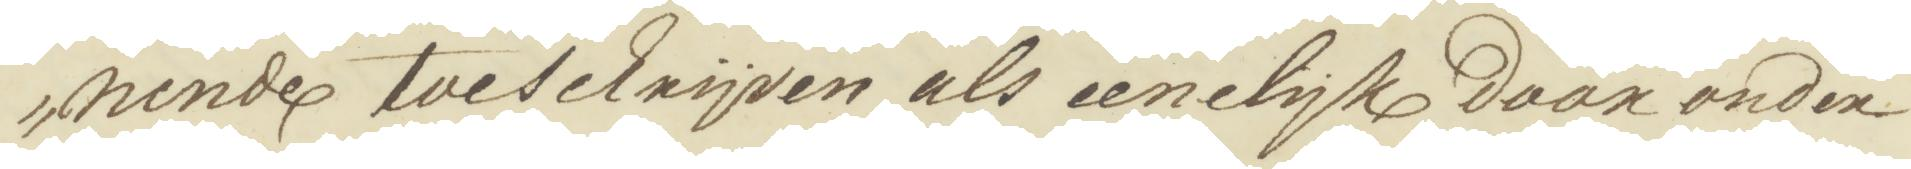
„nende toeschrijven als eenelijk door ouder
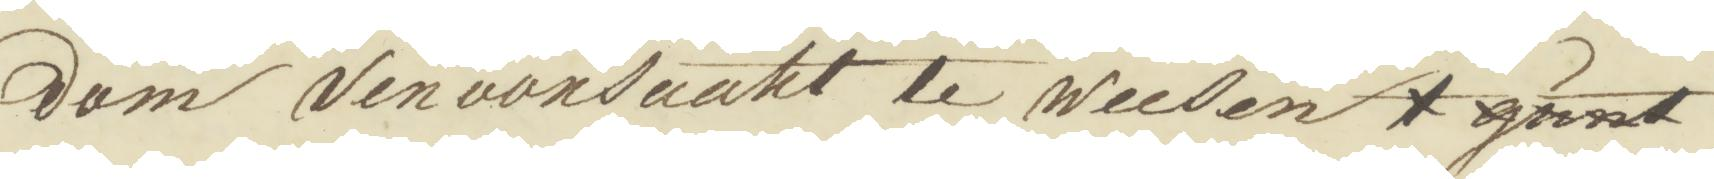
dom veroorsaakt te weesen t gunt
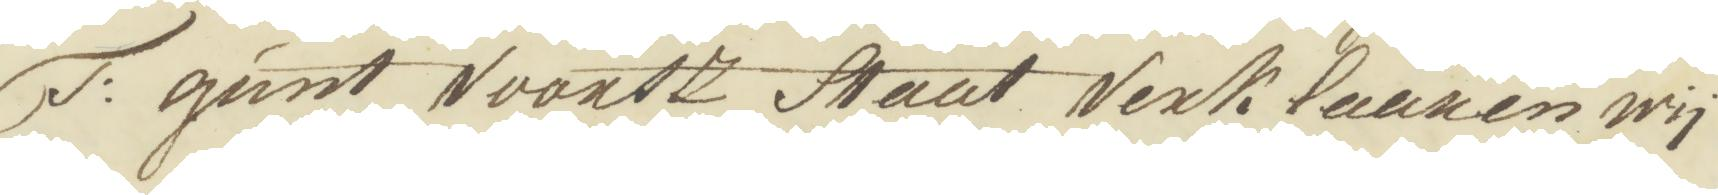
T: gunt voorsz staat verklaaren wij
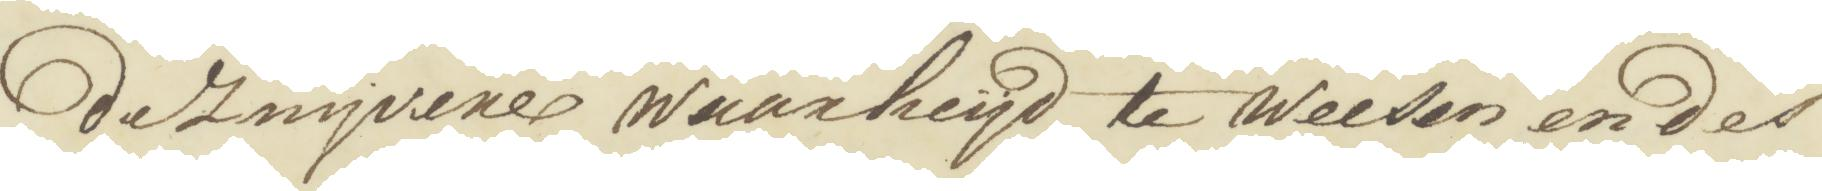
de zuijvere waarheijd te weesen en des
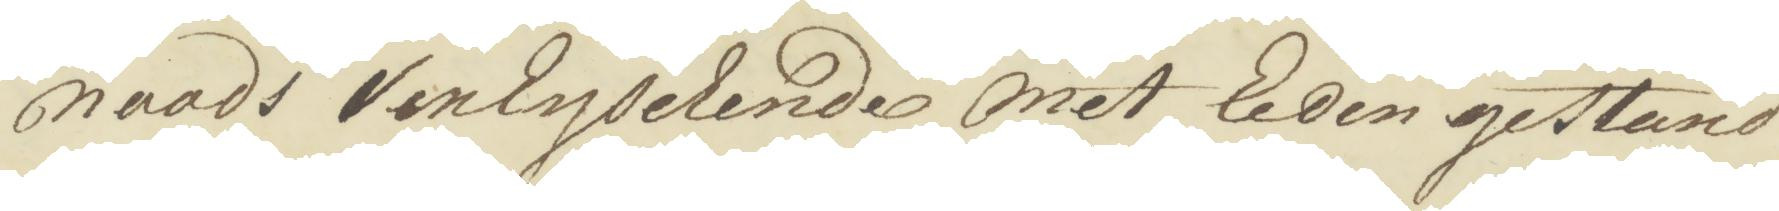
noods VerEyschende met Eeden gestand
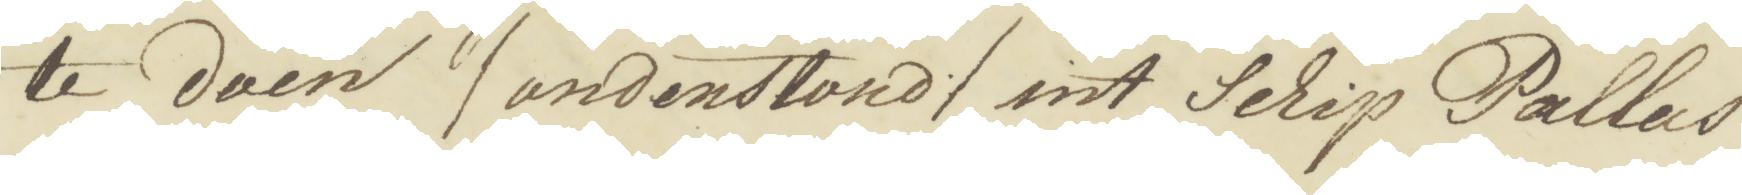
te doen /onderstond:/ int schip Pallas
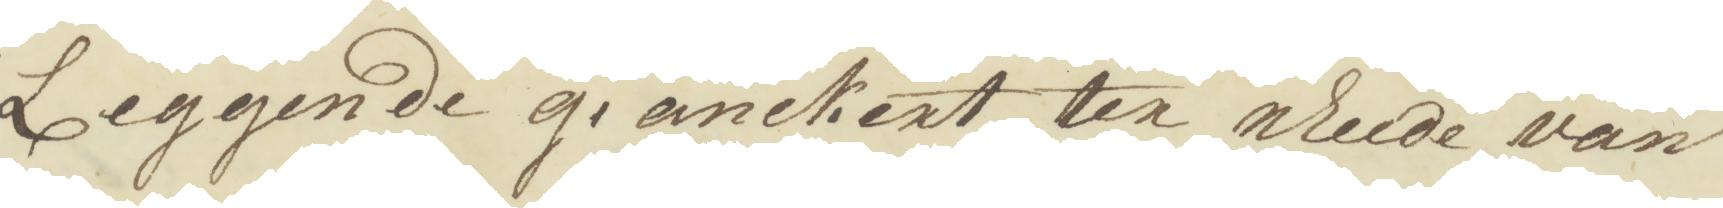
leggende g'anckert ter rheede van
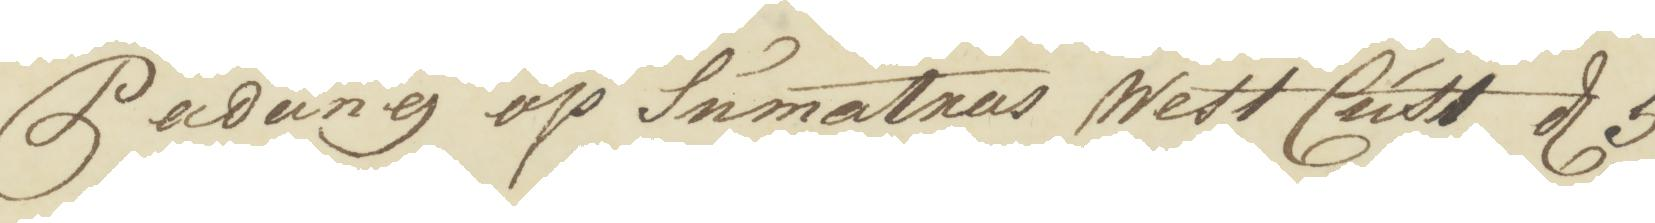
Padang op Sumatras west Cust d 5
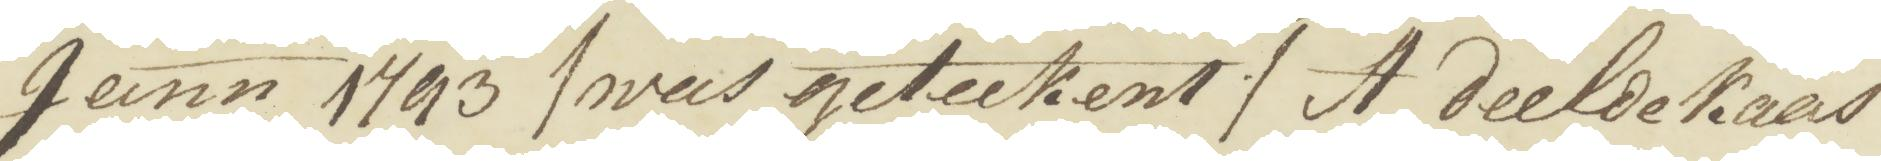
Janu 1743 /was geteekent'/ A deeldekaas
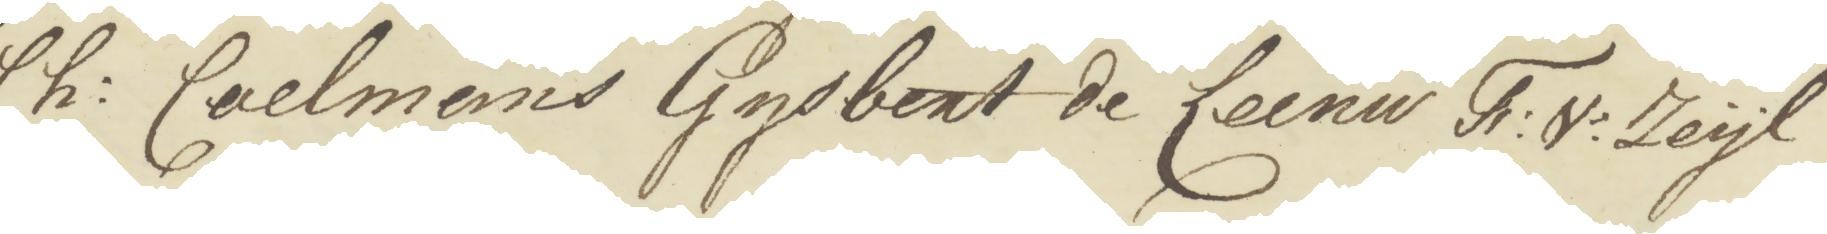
Ch: Coelmans Gysbert de Leeuw F: v: Zeijl
